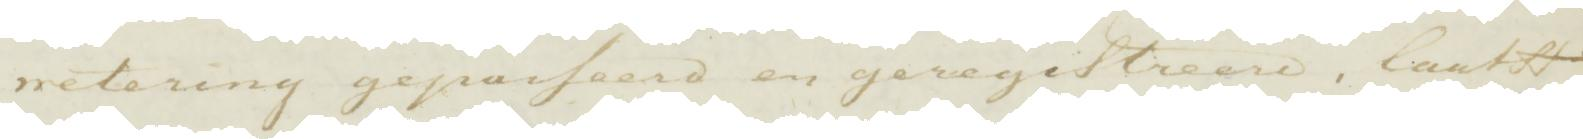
wetering gepasseerd en geregistreerd, laatst
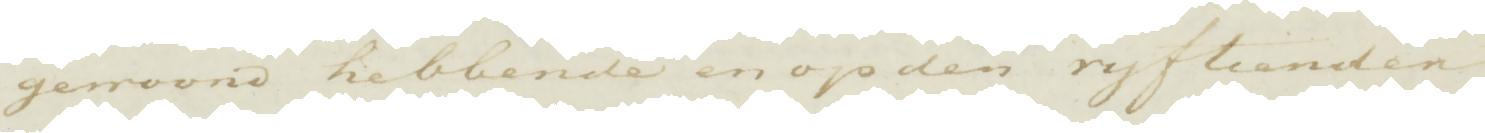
gewoond hebbende en op den vyftienden
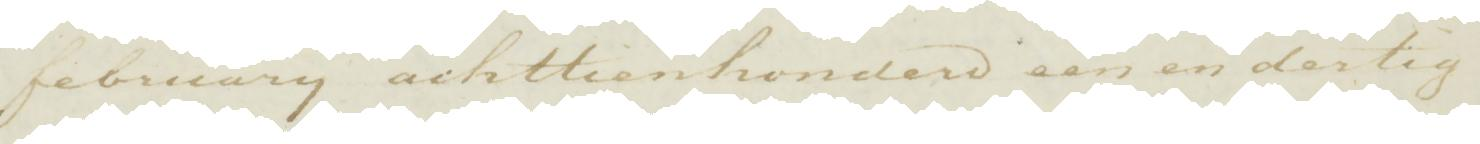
february achttienhonderd een en dertig
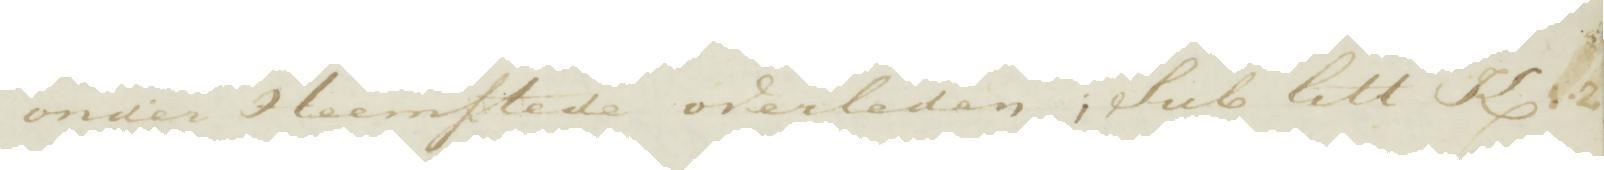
onder Heemstede overleden; sub litt K 1.2
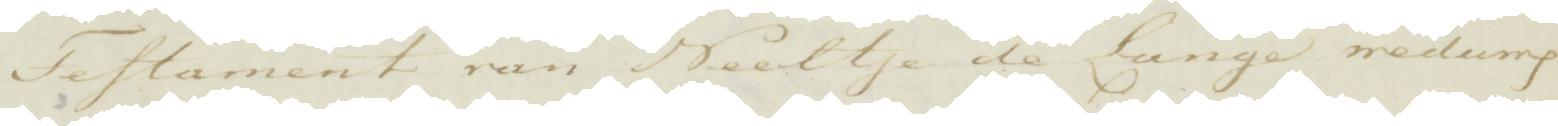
Testament van Neeltje de lange weduwe
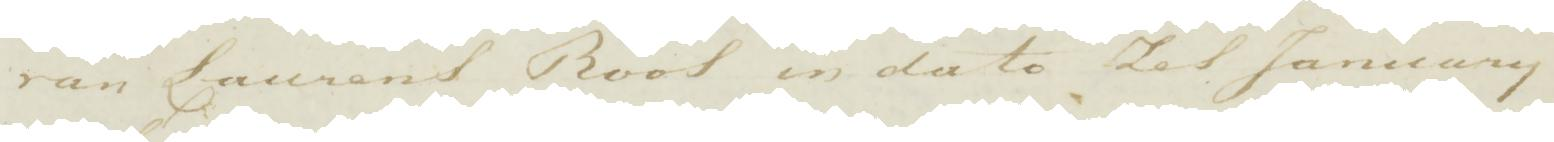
van Laurens Roos in dato Zes January
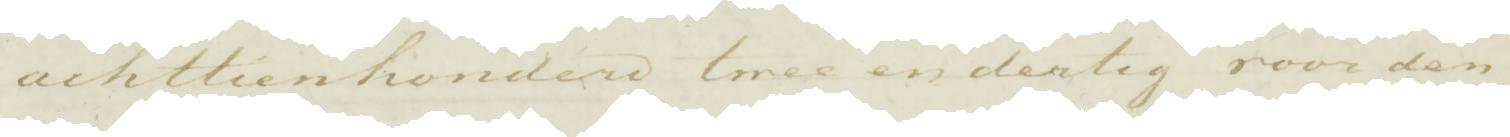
achttienhonderd twee en dertig voor den
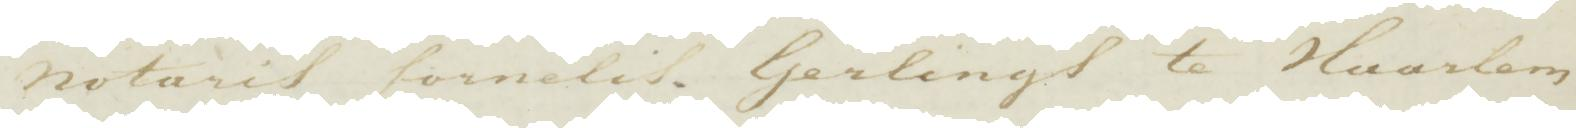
notaris Cornelis Gerlings te Haarlem
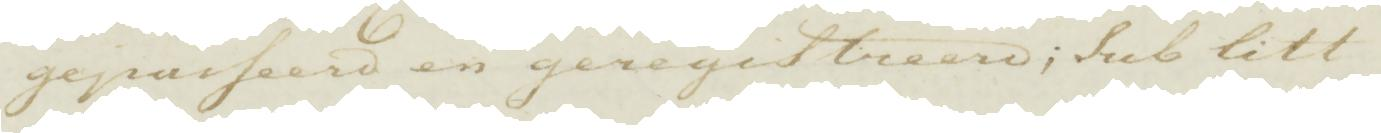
gepasseerd en geregistreerd; sub litt L.
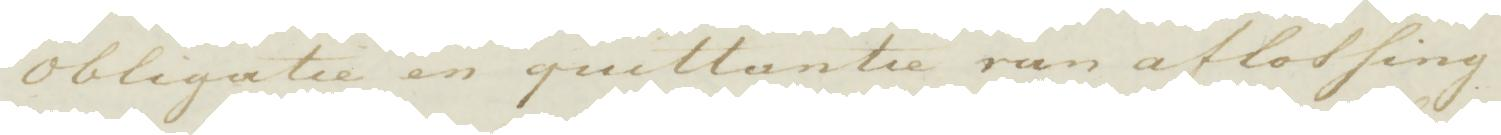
Obligatie en quittantie van aflossing
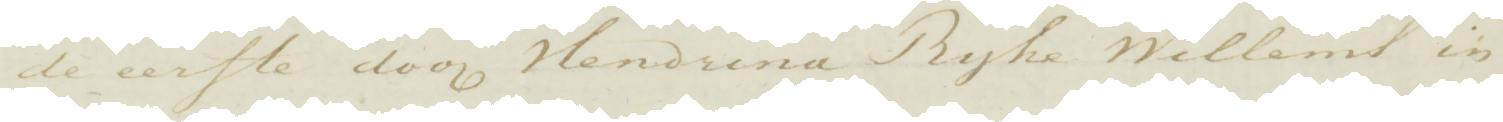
de eerste door Hendrina Ryke Willems in
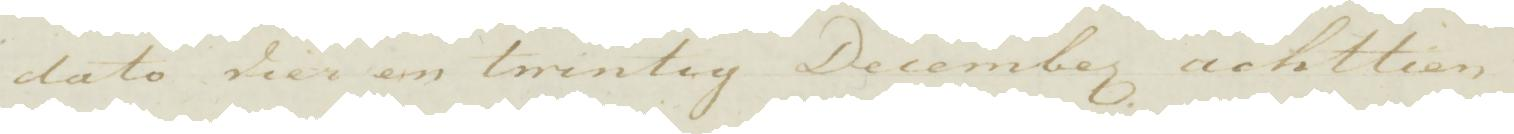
dato vier en twintig December achttien
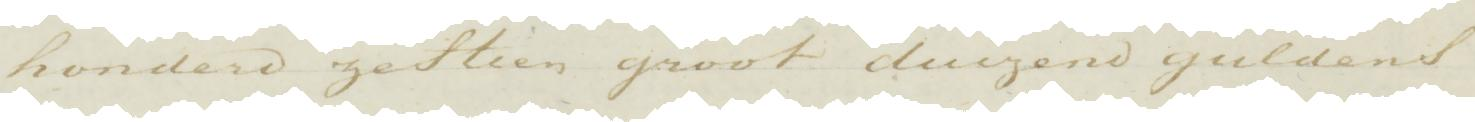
honderd zestien groot duizend guldens
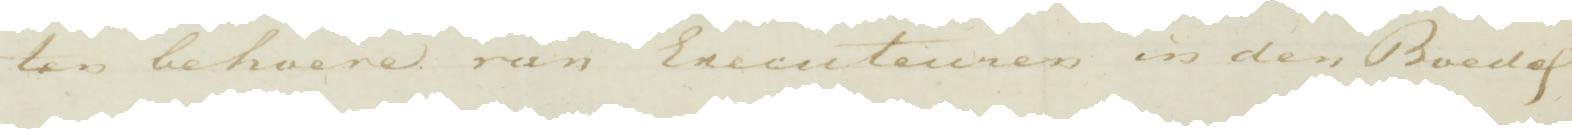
ten behoeve van Executeuren in den Boedel
